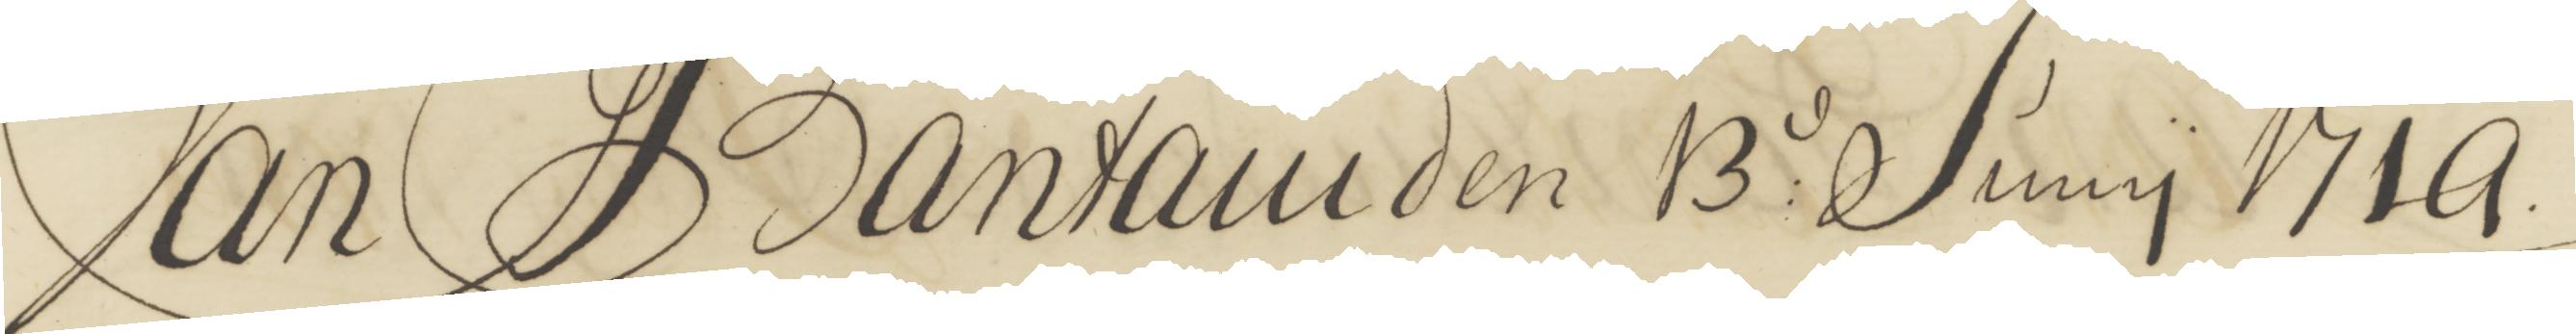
Van Bantam den 13:e Junij 1714.
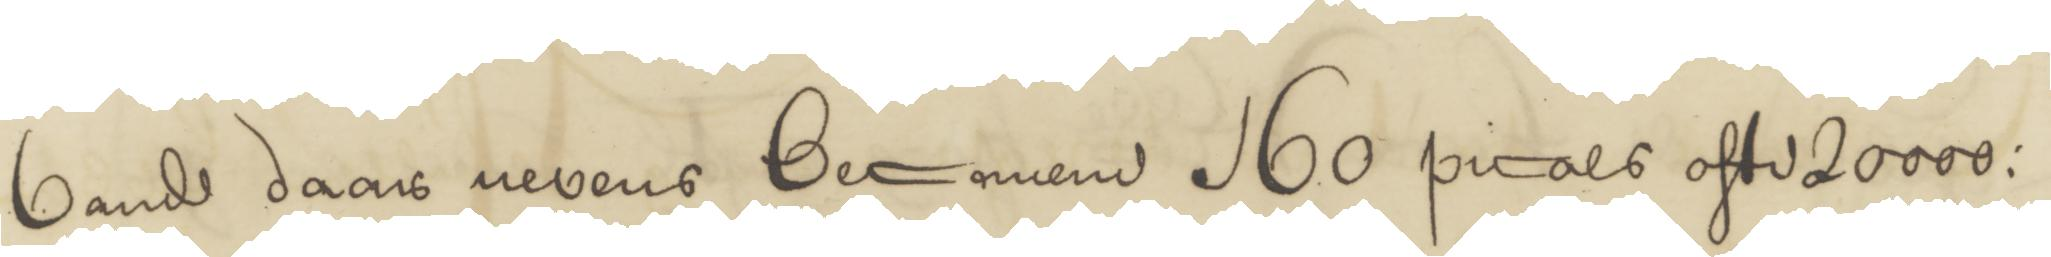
vande daar nevens becomene 160 picols ofte 20000:
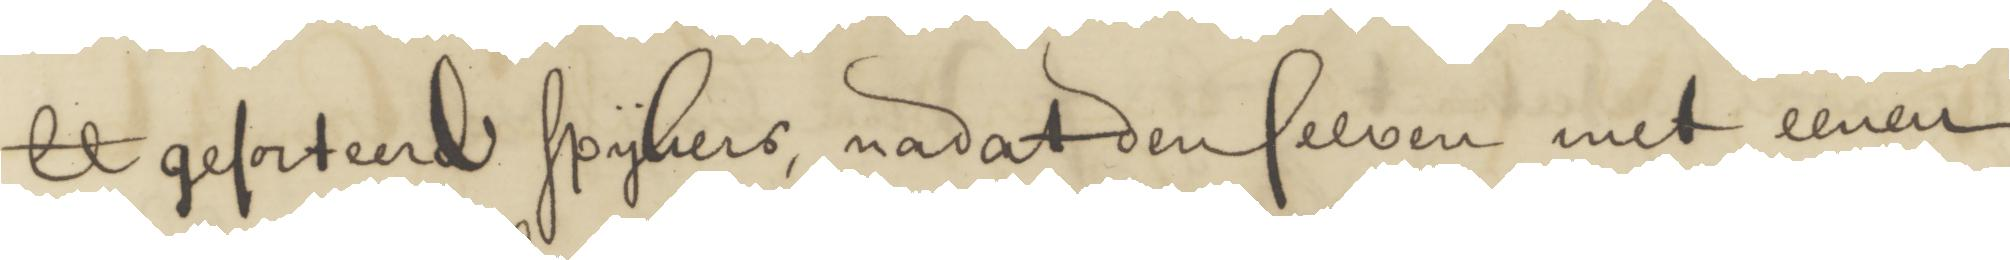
lb gesorteerde spijkers, nadat denselven met eenen
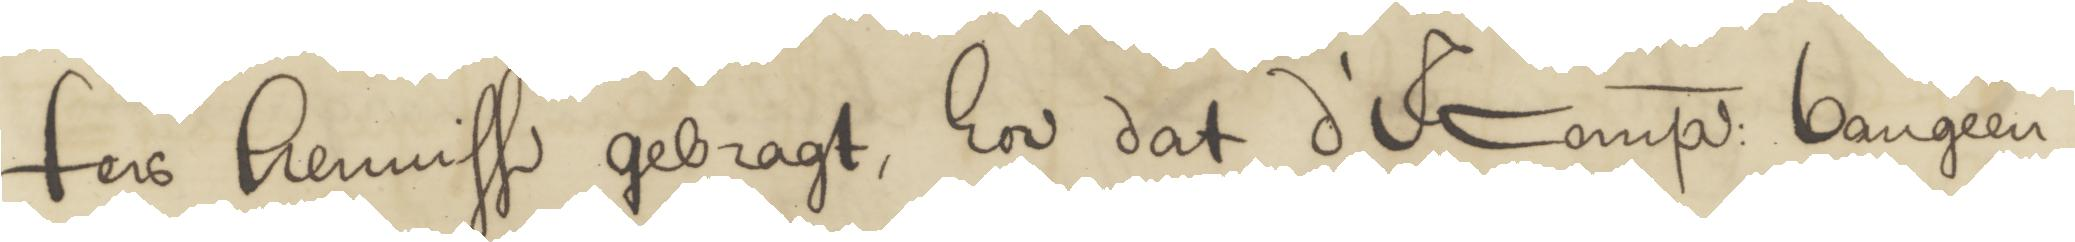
ter kennisse gebragt, hoe dat d’ ECompe: van geen
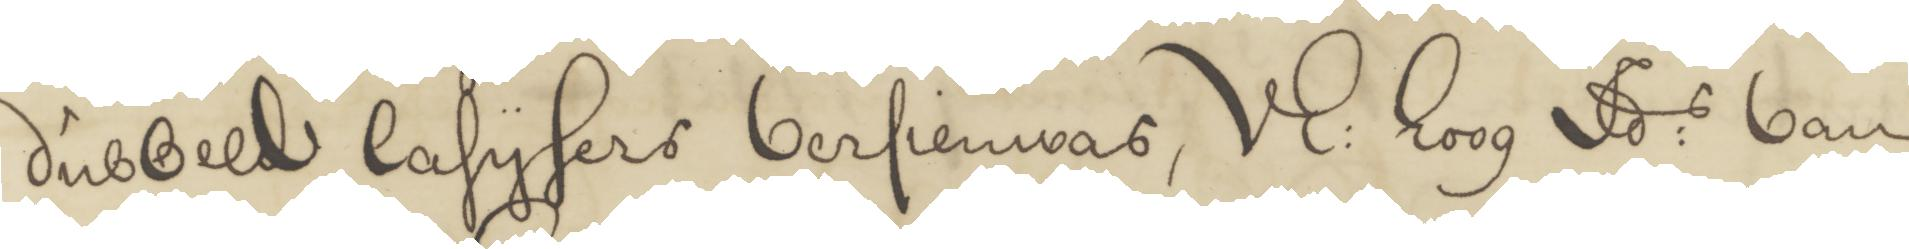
dubbelde lasijsers versien was, UE: hoog Ed:s van
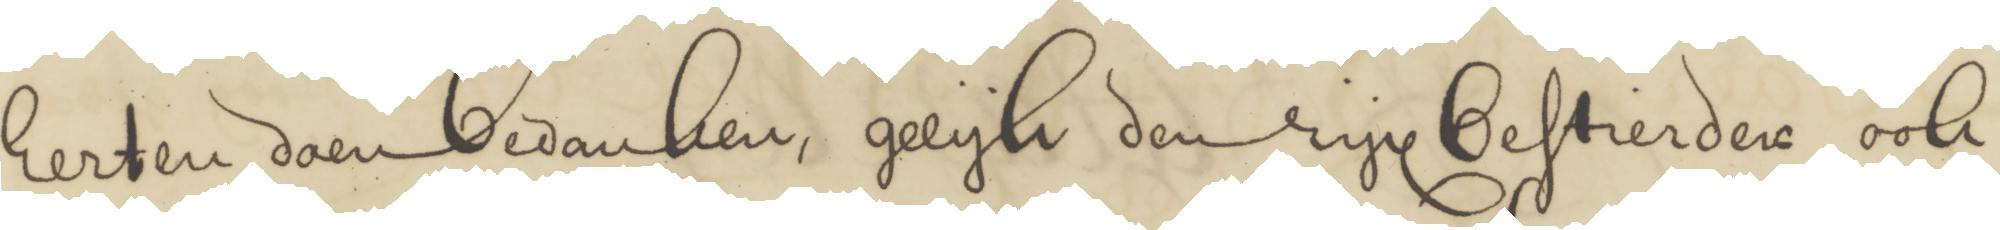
herten doen bedanken, gelijk den rijxbestierder ook
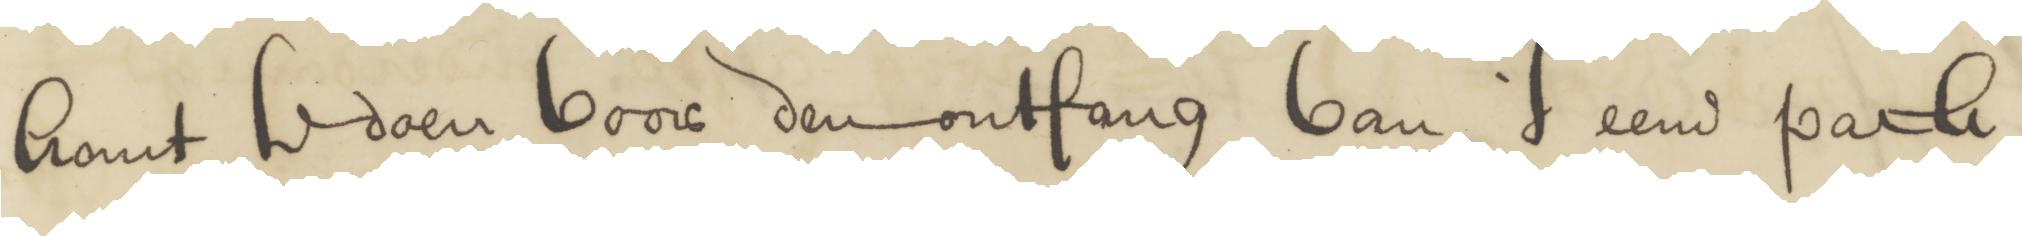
komt te doen voor den ontfang van ’t eene pack
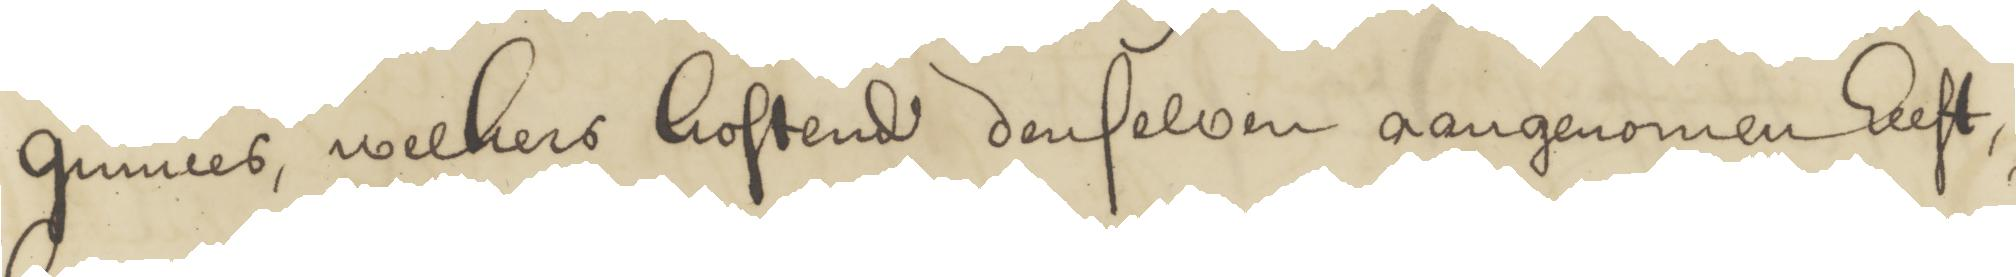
guinees, welkers kostende denselven aangenomen heeft,
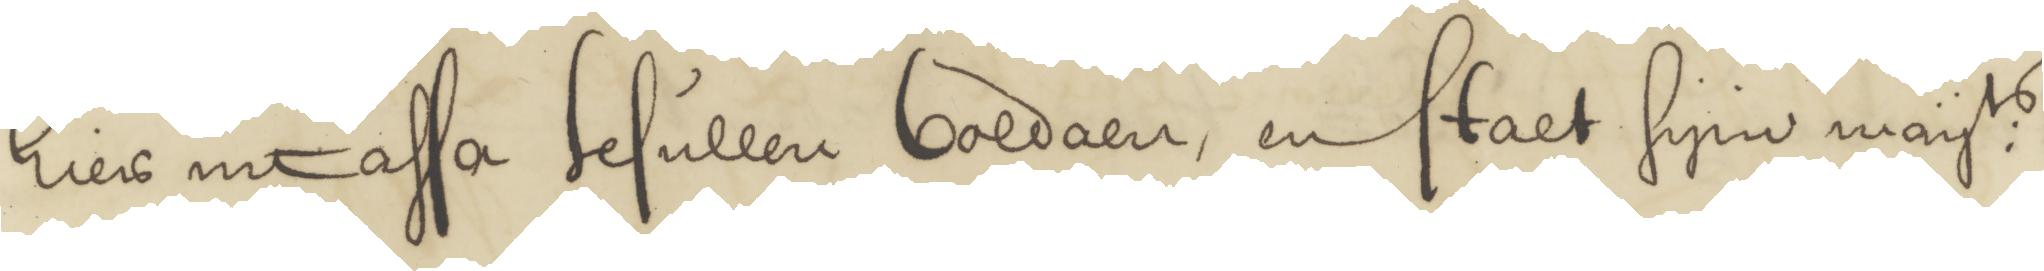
hier incassa tesullen voldoen, en staet sijne maij:ts
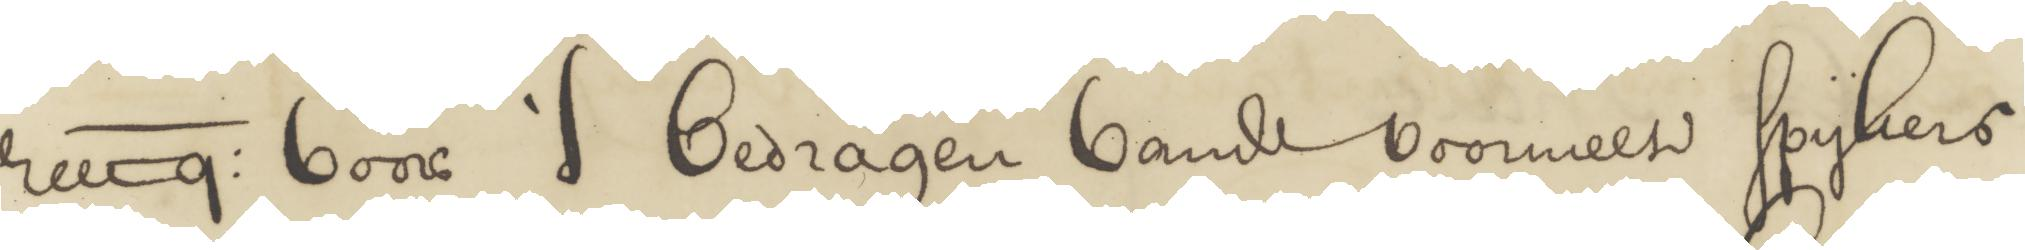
reecq: voor ’t bedragen vande voormelte spijkers
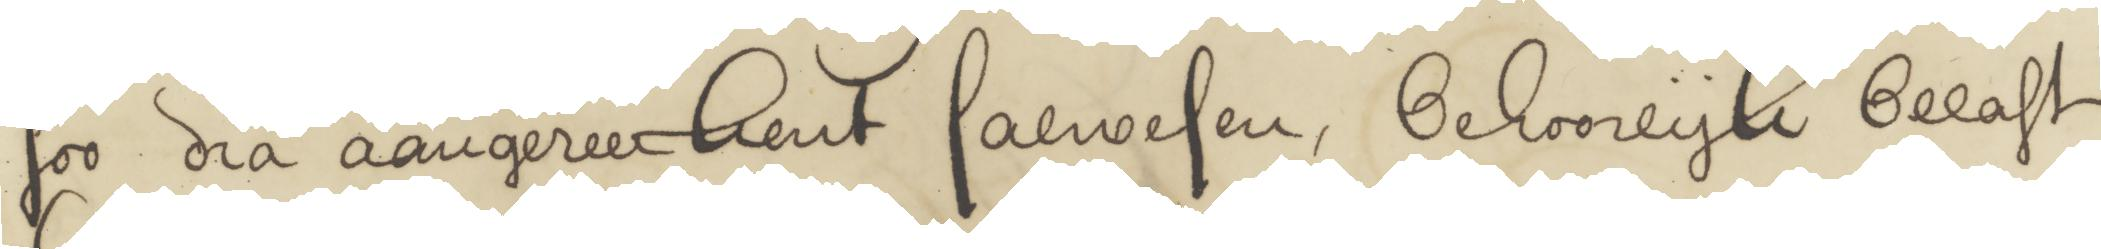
soo dra aangereeckent salwesen, behoorlijk belast
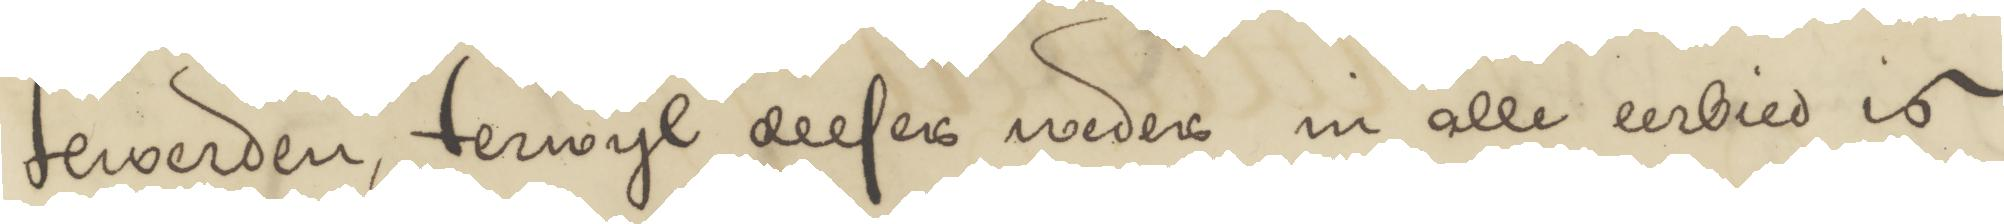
tewerden, terwijl deeser weder in alle eerbied is
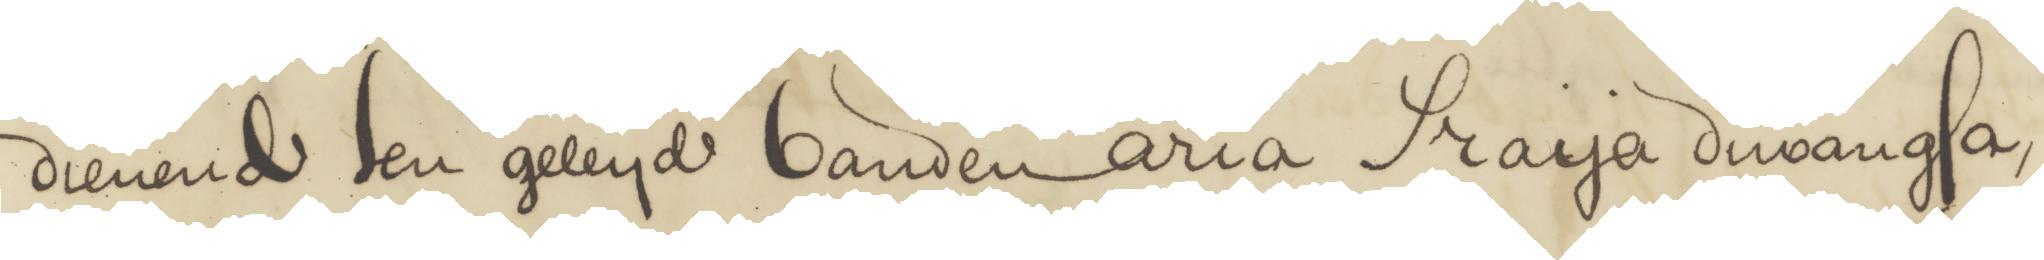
dienende ten geleijde vanden aria sraija diwangsa,
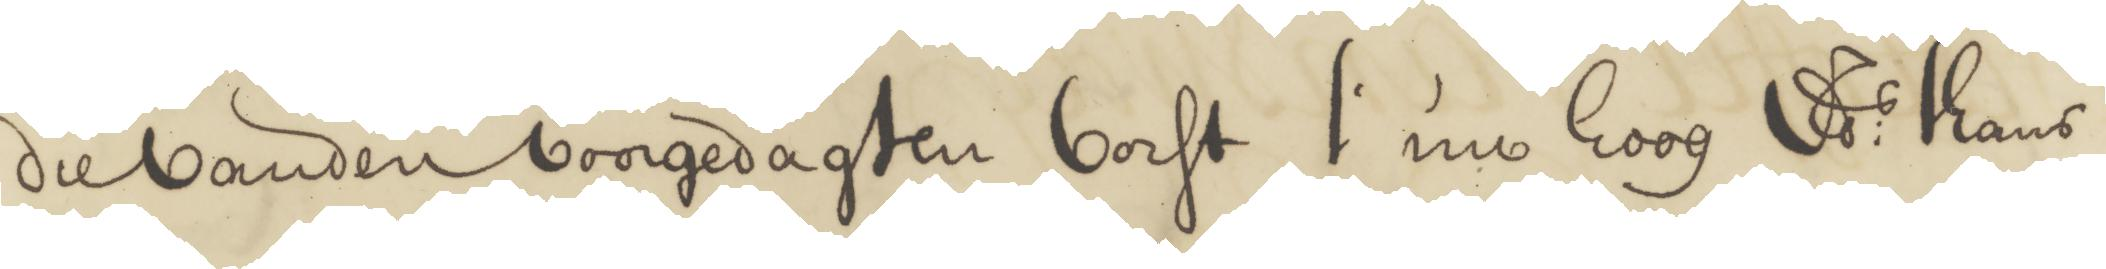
die vanden voorgedagten vorst t’ uw hoog Ed:s thans
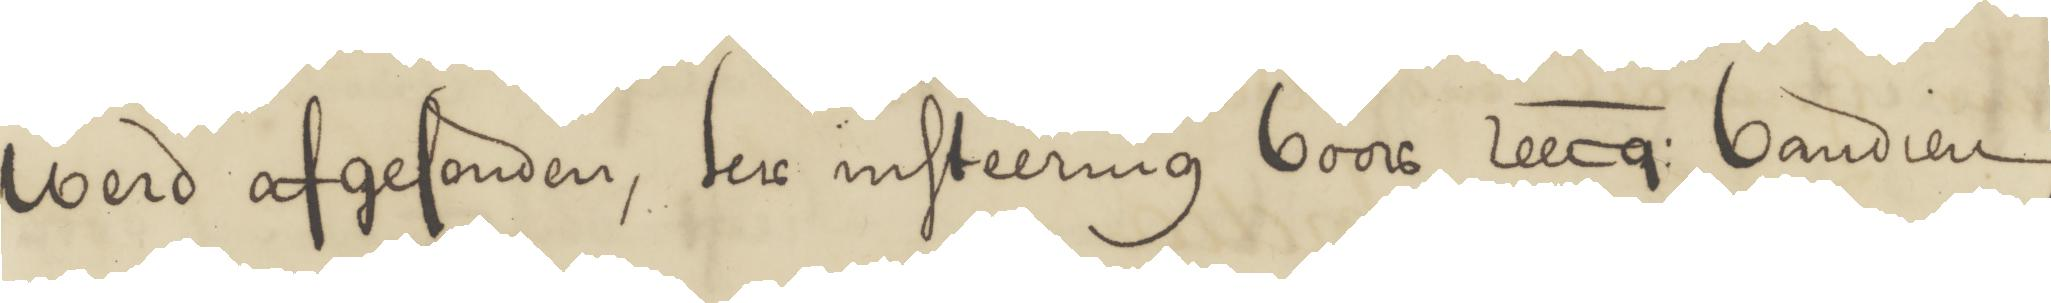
werd afgesonden, ter insteering voor reecq: vandien
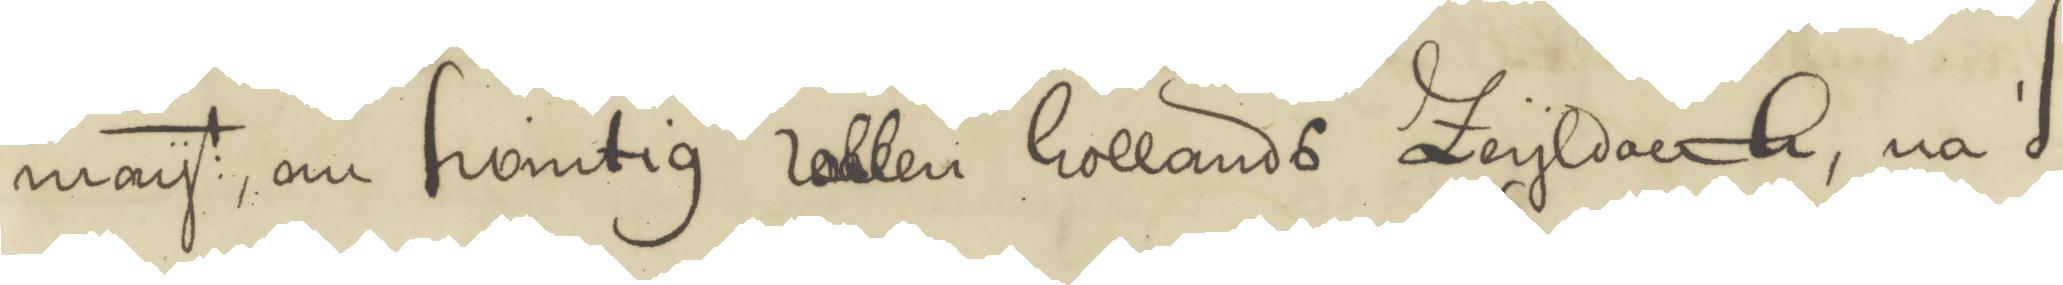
maij:t, om twintig rollen hollands zeijldoeck, na ’t
